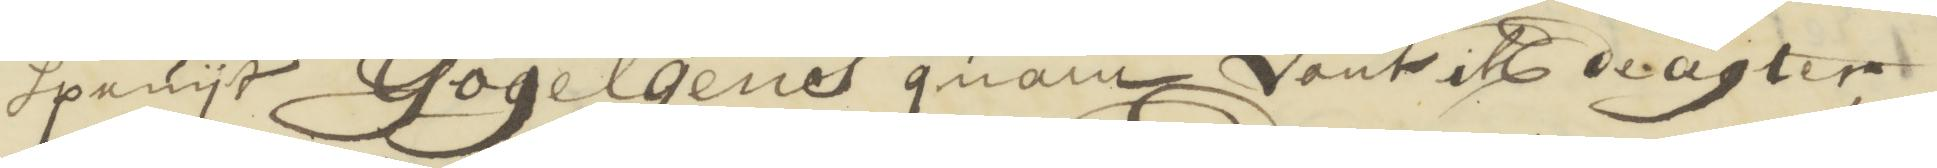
spruijt Gogelgens quam vont ik de agter,
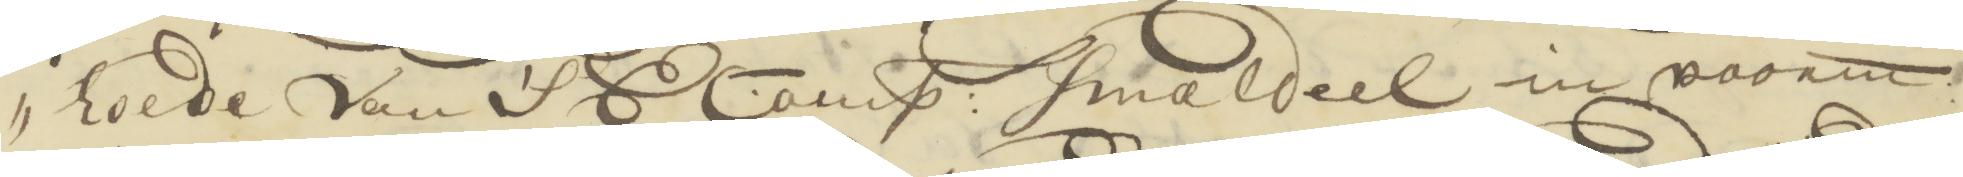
„hoede van 'S E Comp:s smaldeel in voorm
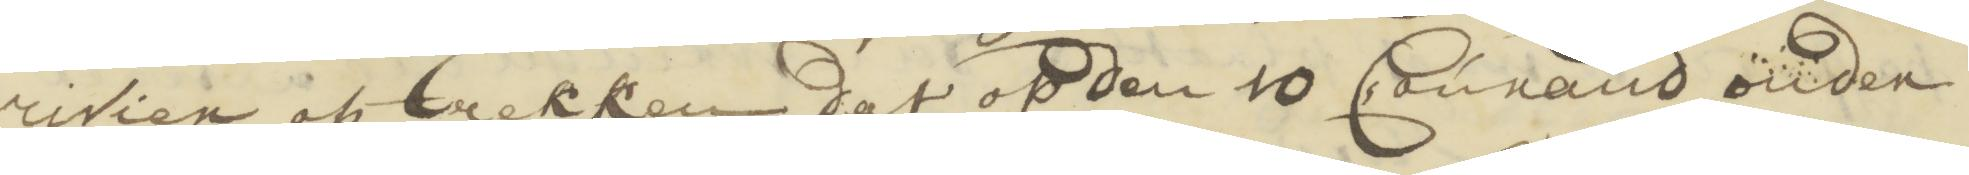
rivier op trekken dat op den 10 Courand onder
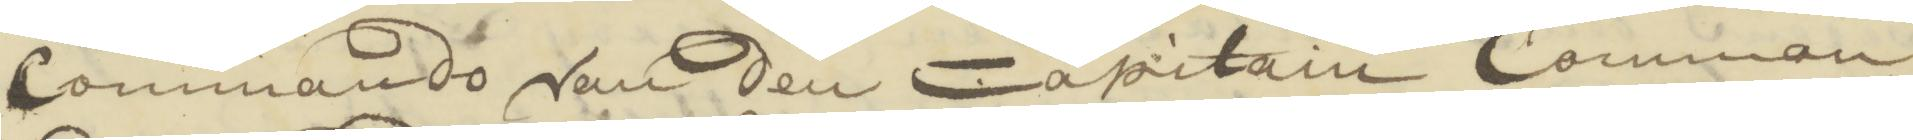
Commando van den Capitain Comman
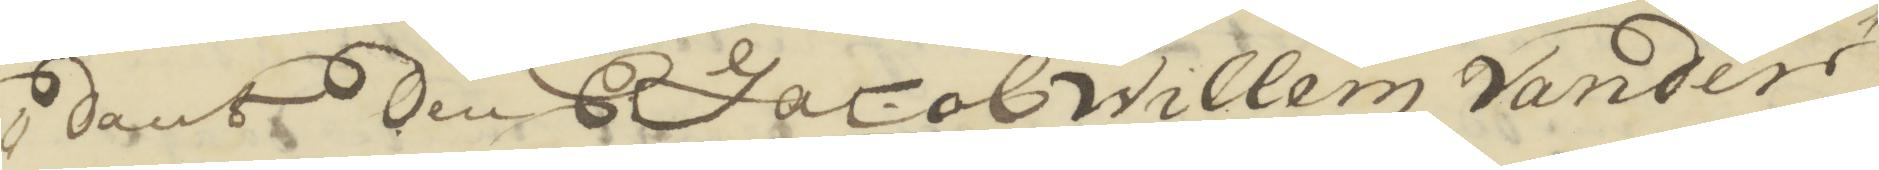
„dant den E Jacob Willem vander
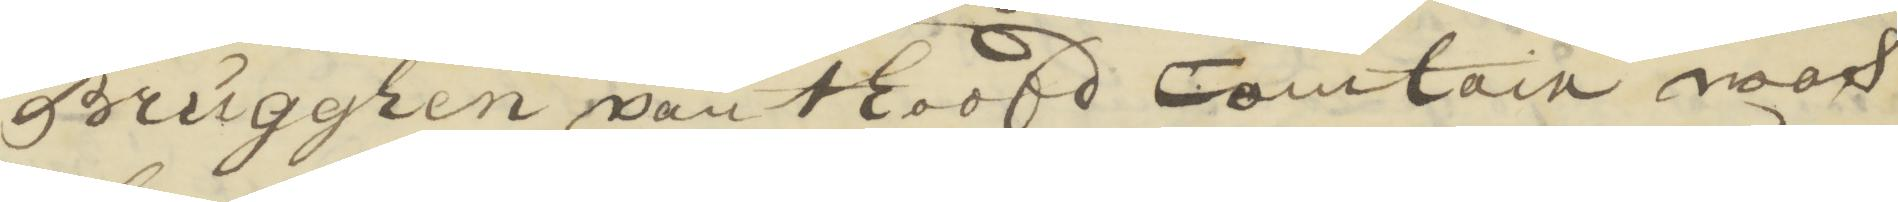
Brugghen van thoofd comtoir was
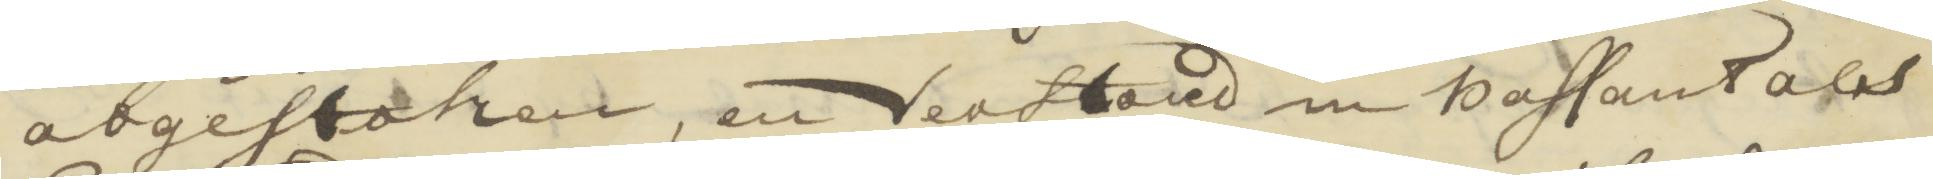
afgestoken, en verstond in passant als
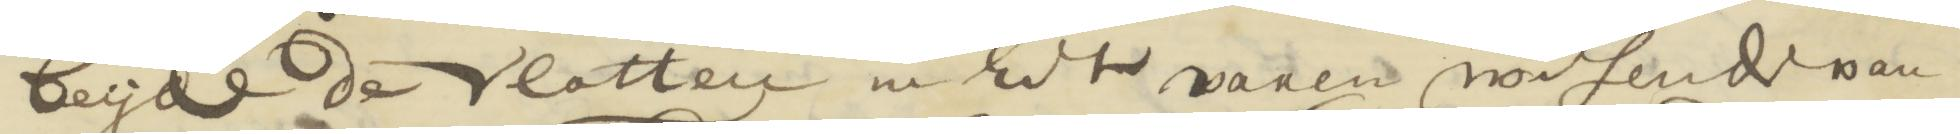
beijde de vlotten in het varen wesende van
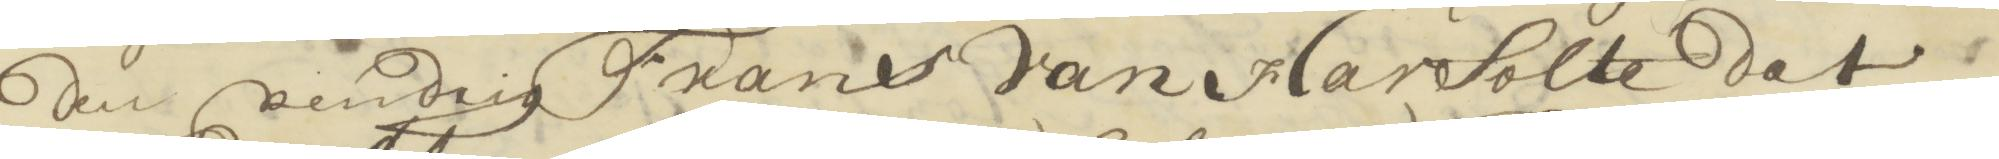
den vendrig Frans van Harsolte dat
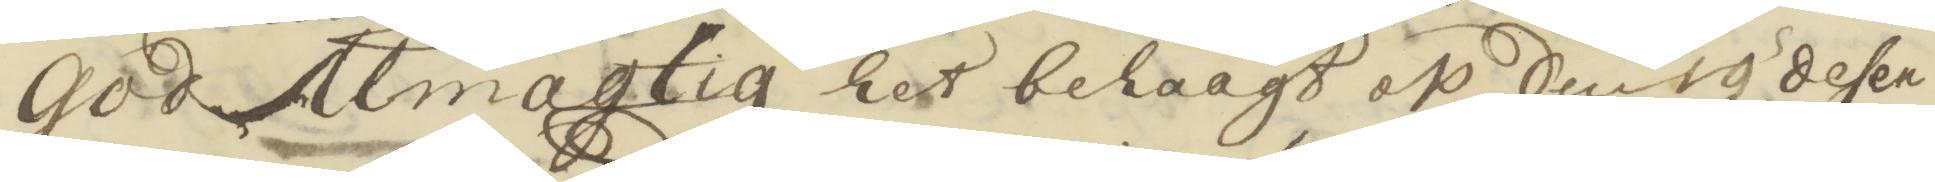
god Almagtig het behaagt op den 19' deser
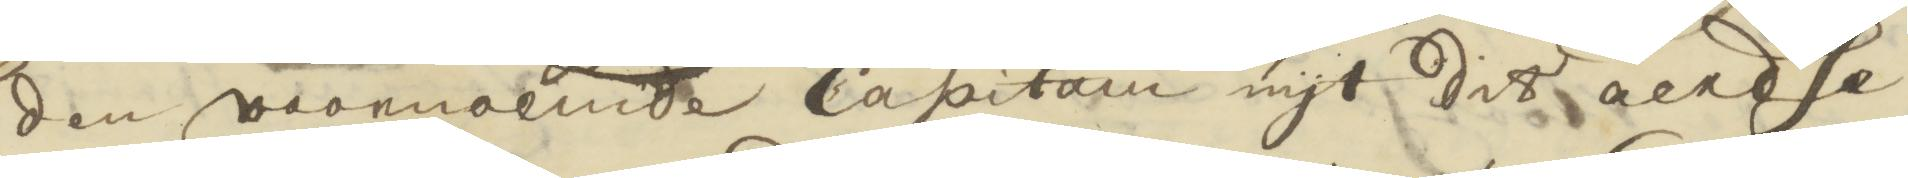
den voornoemde Capitain uijt dit aerdse
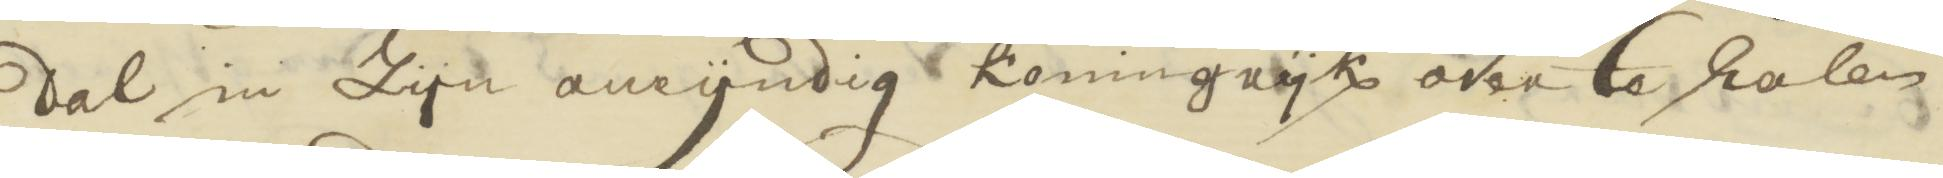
dal in zijn oneijndig koningrijk over te halen
